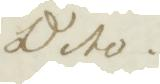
Dito. . . . . . . . .
